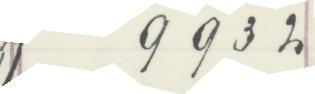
ƒ 9932
